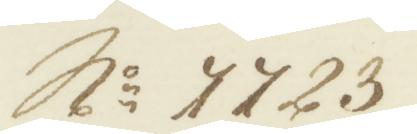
N=o 7723.
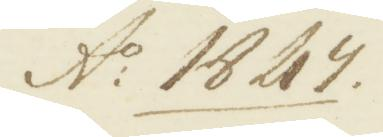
A:o 1847.
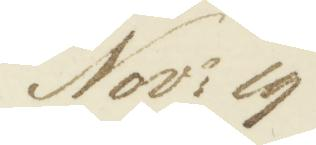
Nov:r 19
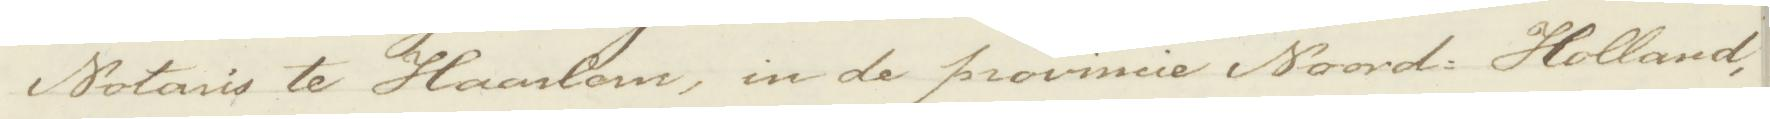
Notaris te Haarlem, in de provincie Noord: Holland,
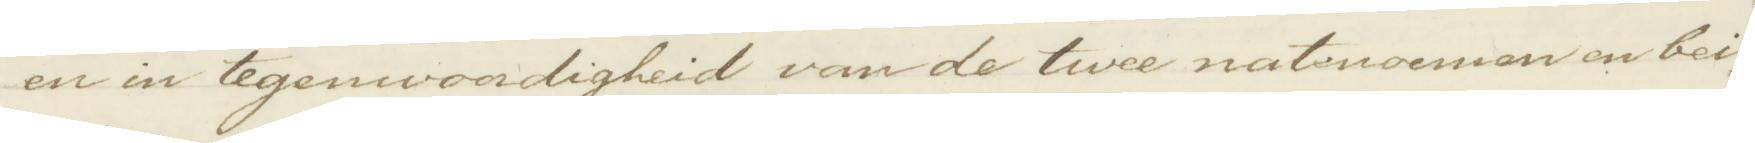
en in tegenwoordigheid van de twee natenoemen en bei„
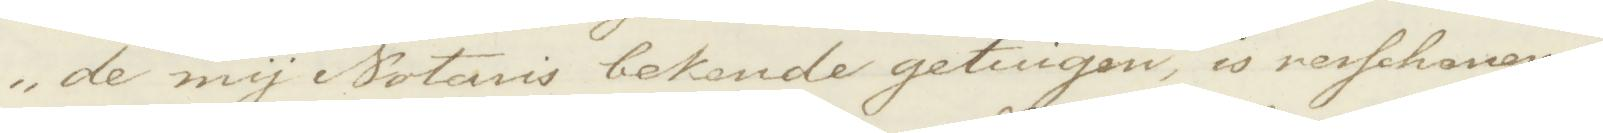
„de mij Notaris bekende getuigen, is verschenen:
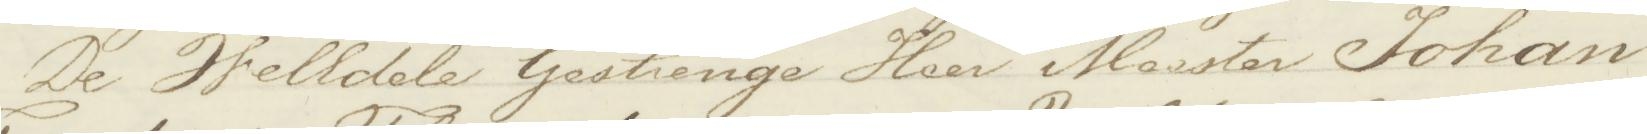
De WelEdele Gestrenge Heer Meester Iohan
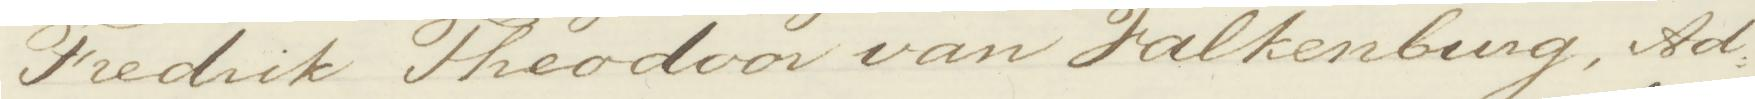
Fredrik Theodoor van Valkenburg, Ad:
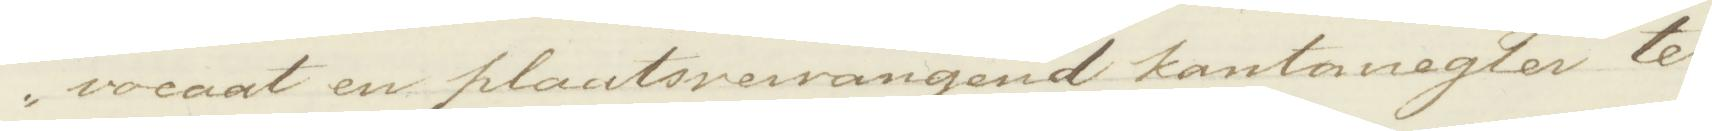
„vocaat en plantsvervangend kantonregter te
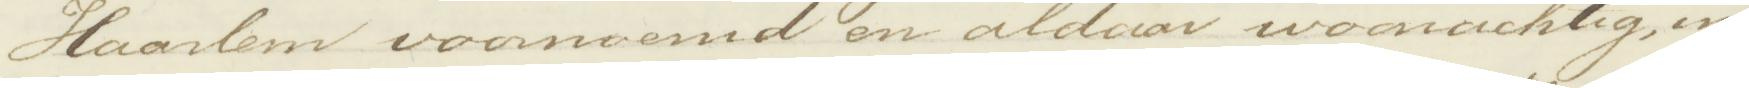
Haarlem voornoemd en aldaar woonachtig, in
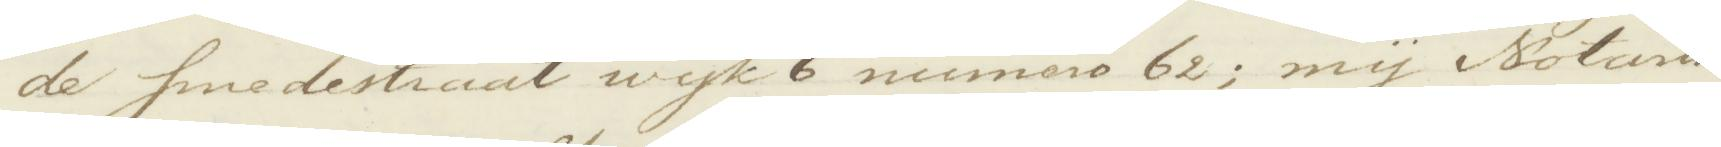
de Smedestraat wijk 6 numero 62; mij Notaris
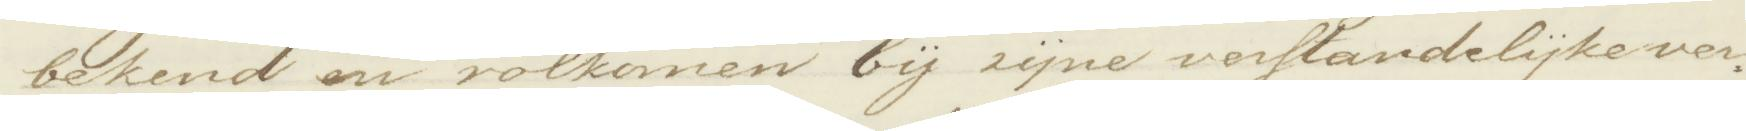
bekend en volkomen bij zijne verstandelijke ver
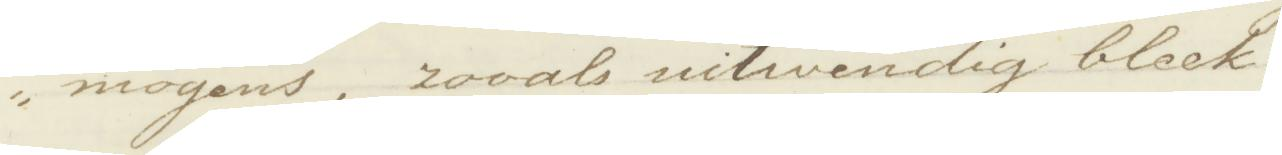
„mogens, zooals uitwendig bleek.
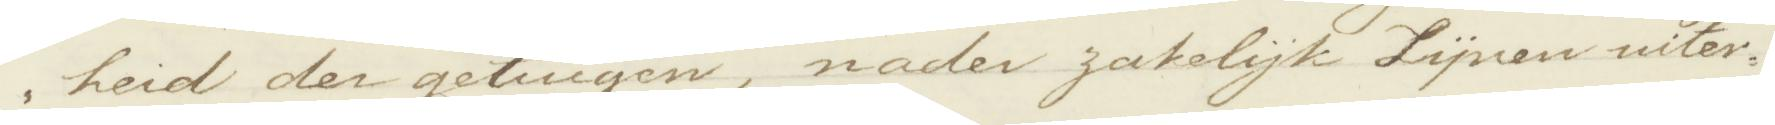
„heid der getuigen, nader zakelijk Zijnen uiter„
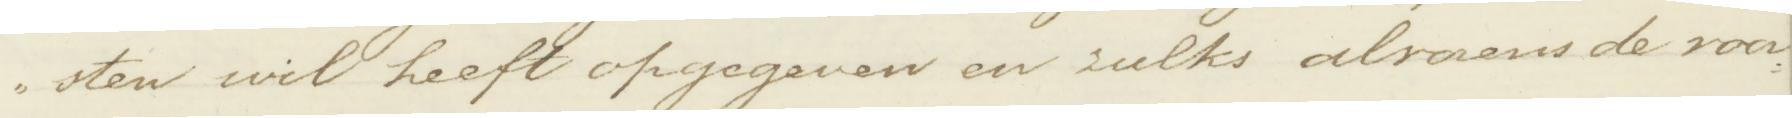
„sten wil heeft opgegeven en zulks alvorens de voor„
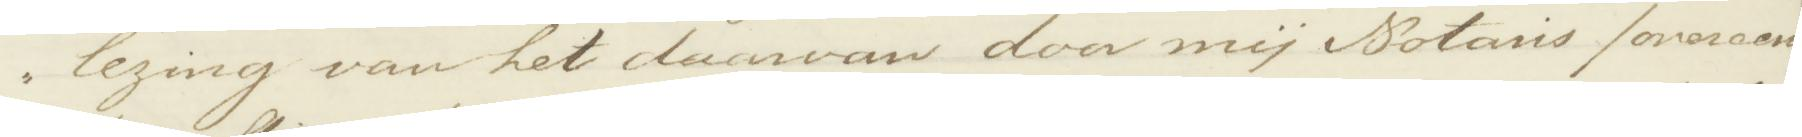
„lezing van het daarvan door mij Notaris /overeen
